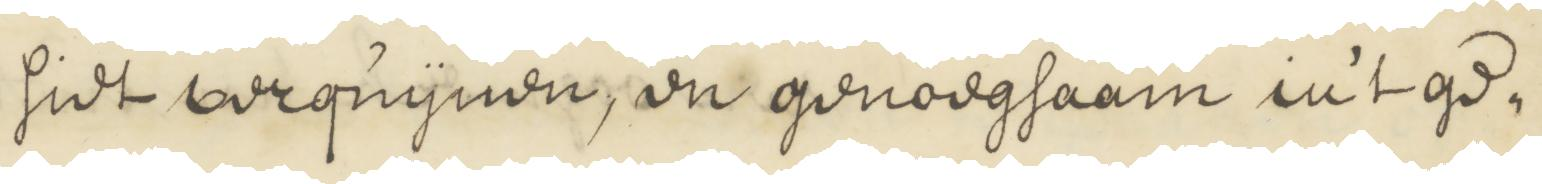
siet verquijnen, en genoegsaam in ’t ge„
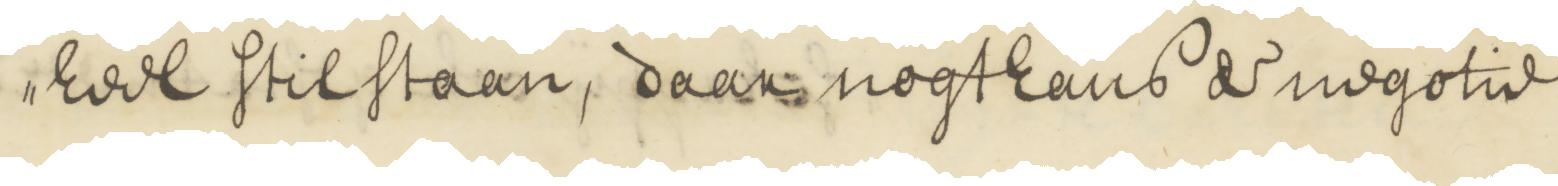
„heel stilstaan, daar nogthans de negotie
